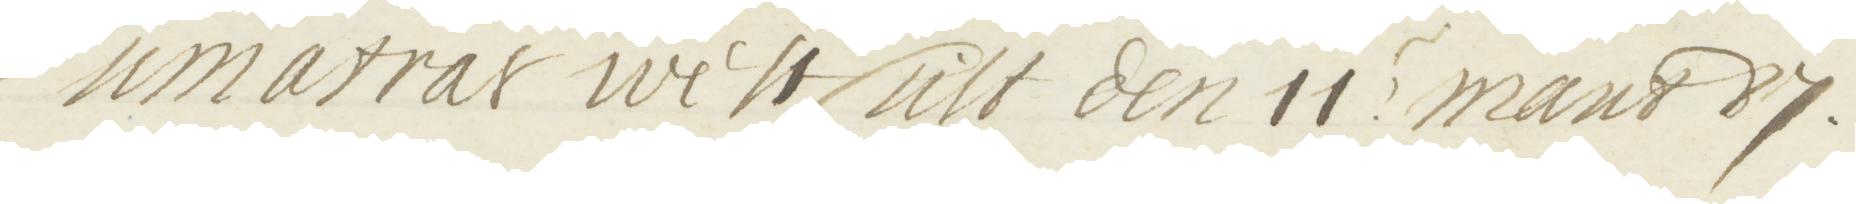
Sumatras West Cust den 11:´ mart 87.
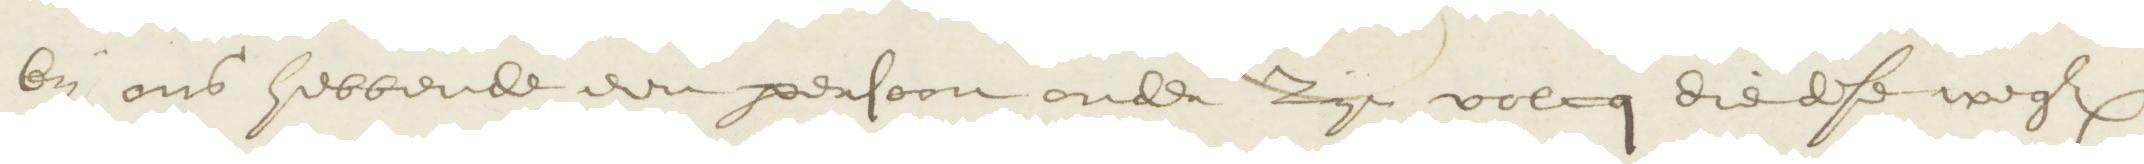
bij ons hebbende een persoon onder Zijn volcq die dese wegh
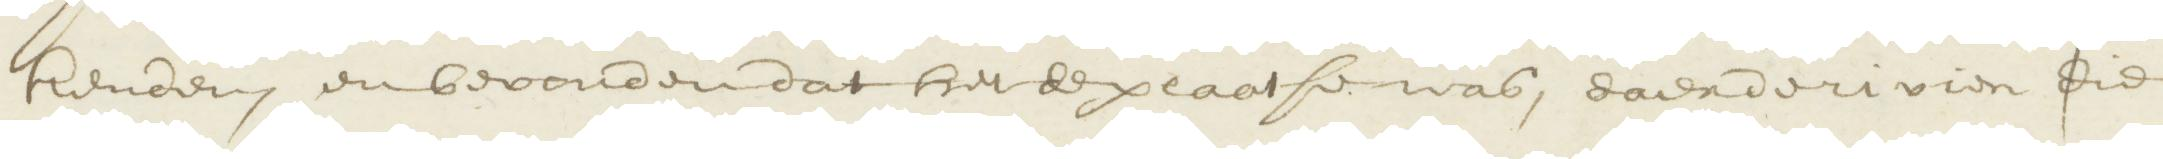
kenden en bevonden dat het de plaatse was, daerde rivier die
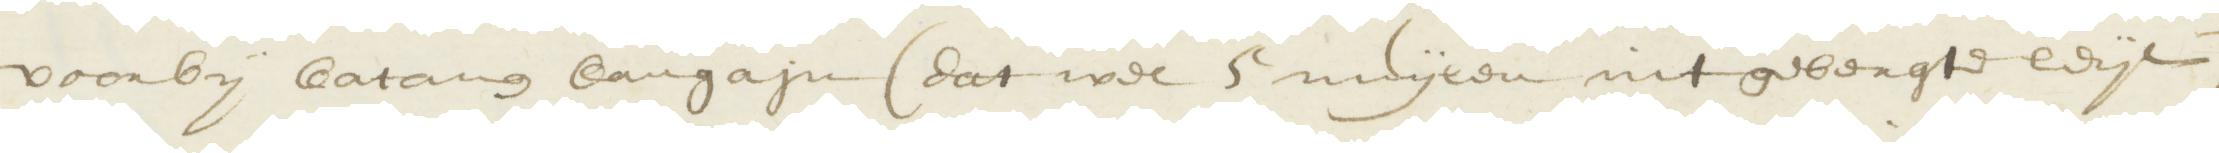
voorbij batang bangaju (dat wel 5 meijlen int gebergte leijt)
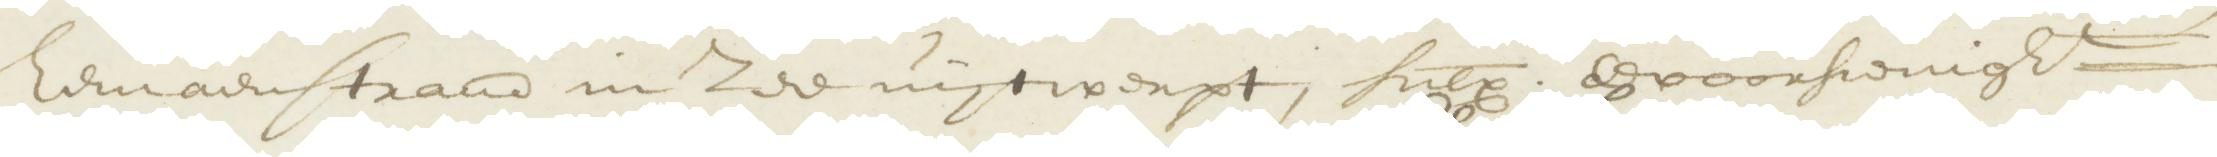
hem aenstrand in Zee uijtwerpt; sulx. devoorsienigh=t
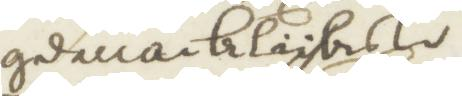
gemacklijkste
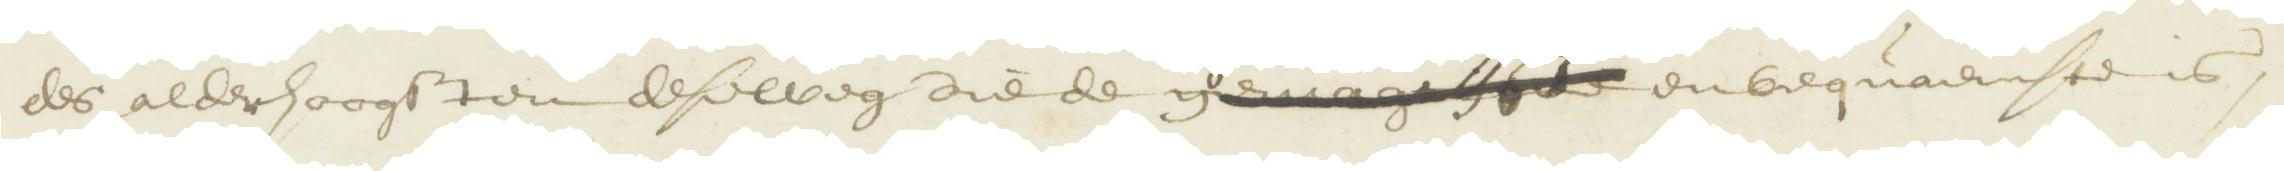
des alderhoogsten deseweg die de gemagtijste en bequaemste is
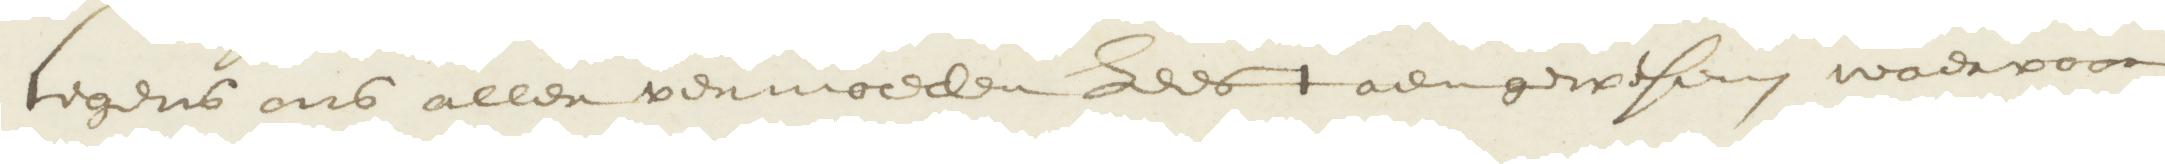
tegens ons aller vermoeden heeft aengewesen, waervoor
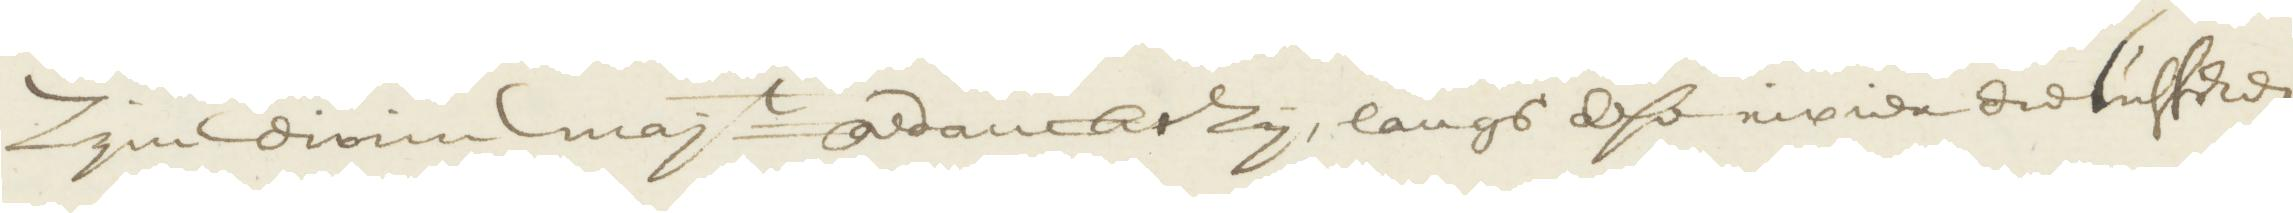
Zijne divine maj=t gedanckt Zij, langs dese rivier die tusschen
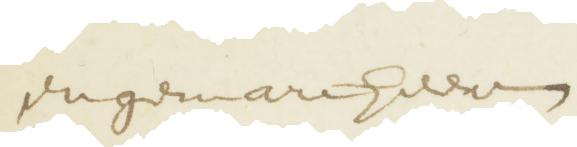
en gemarcheeren
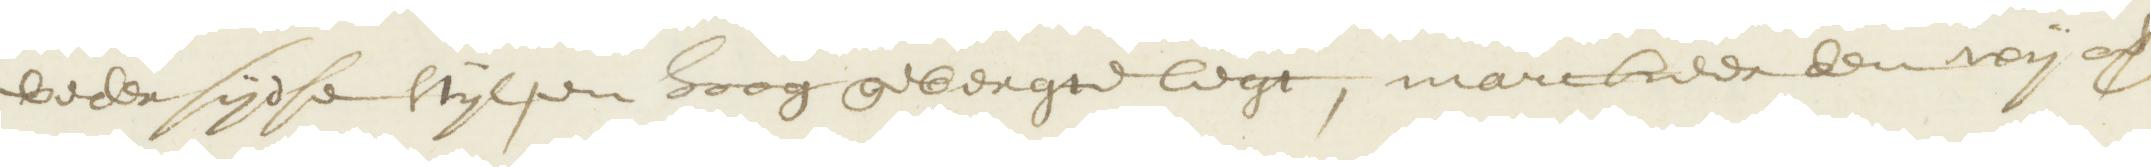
weder sijdse stijl, en hoog gebergte legt, marcheerden wij over
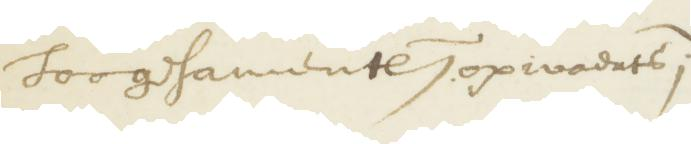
soo gesamentlijk opwaerts;
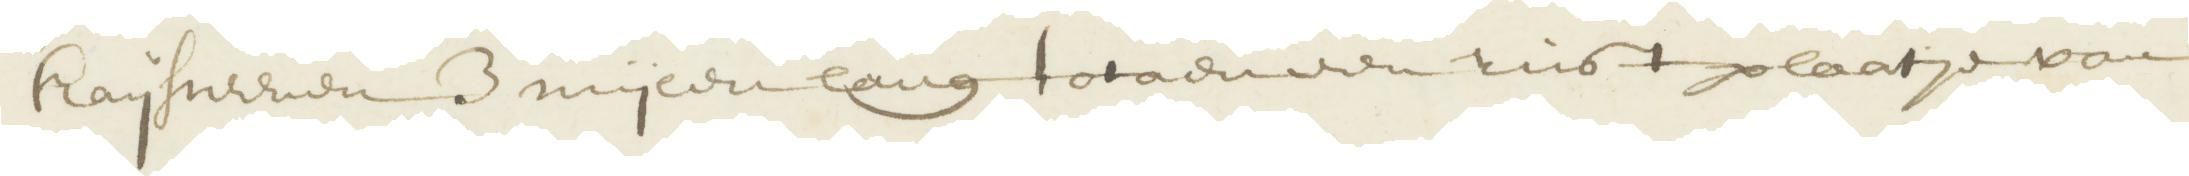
kaijsteenen 3 mijlen lang totaen een rust plaatje van
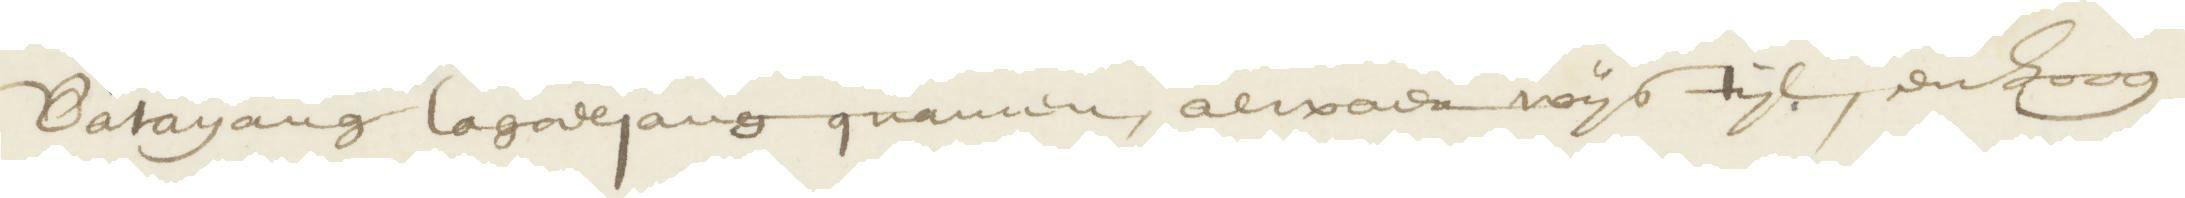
Bataijang tagoeljang quamen, alwaer wijstijl, en hoog
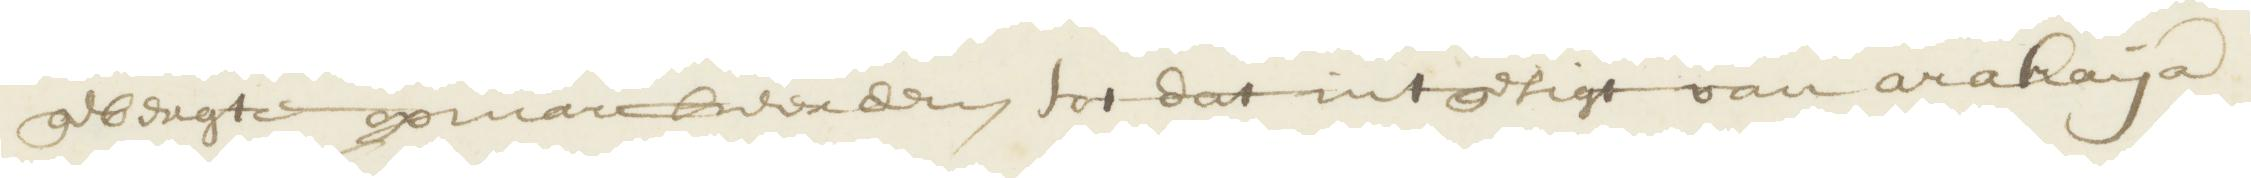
gebergte opmarcheerden, tot dat int gesigt van arakaija
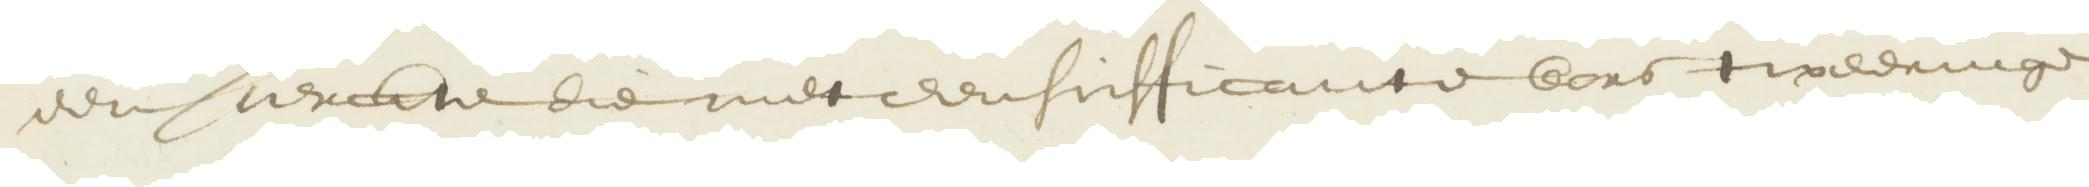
een Cterckte die met een sufficante borstweeringe
